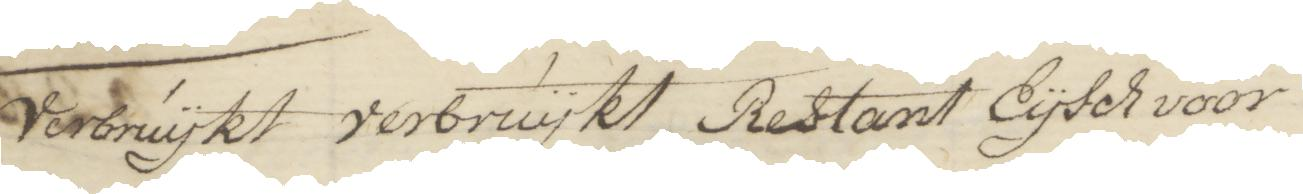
Verbruijkt verbruijkt Restant Eijsch voor
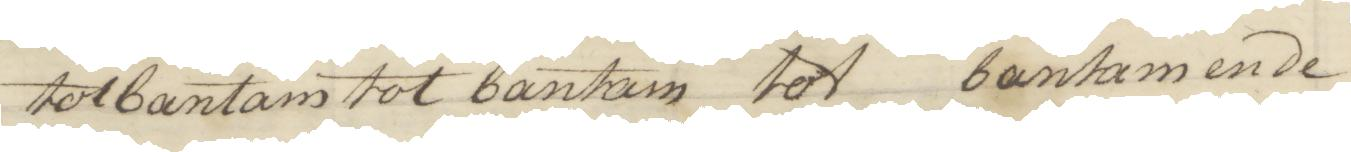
tot bantam tot bantam tot bantam ende
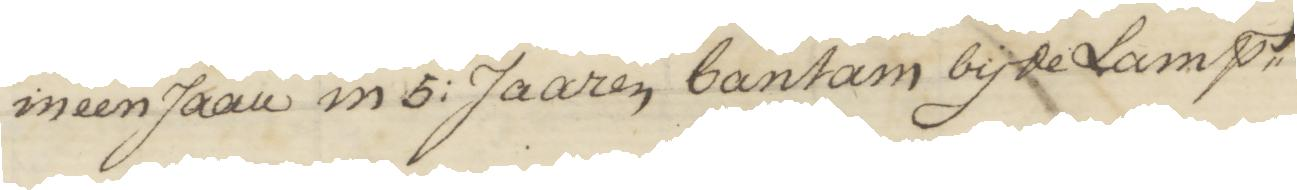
in een Jaar in 5: Jaaren bantam bijde Lamp„s
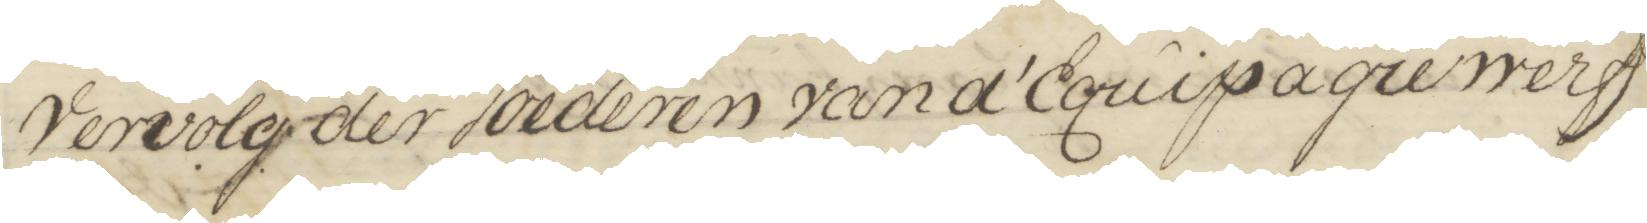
Vervolg der Goederen van d’ Equipagie werff
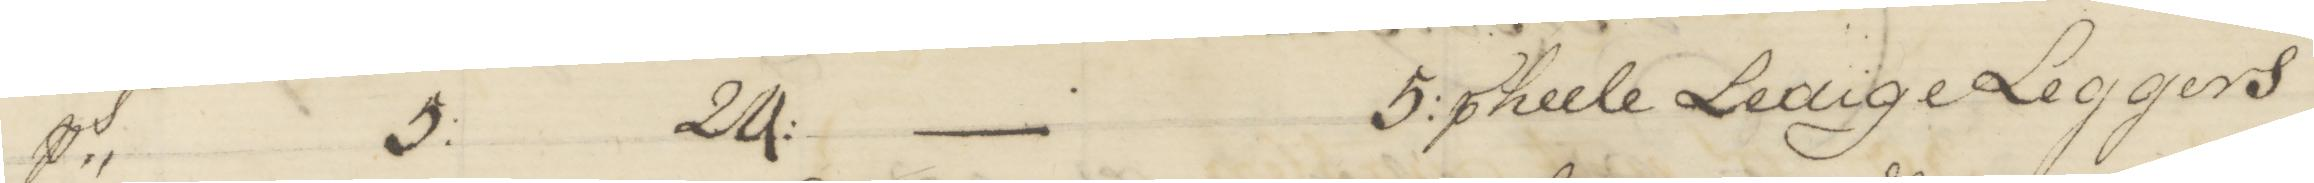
p„s 5: 24: — 5: p'heele Ledige Leggers
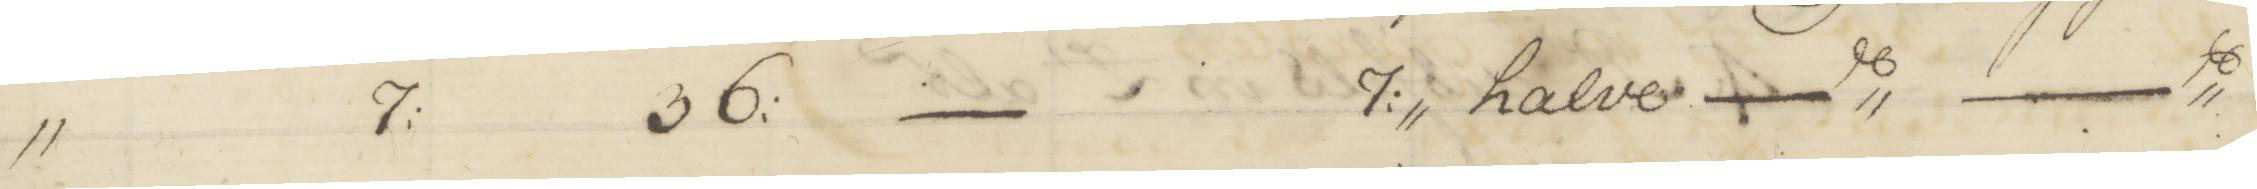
„ 7: 36: — 7: „ halve —„o —„o
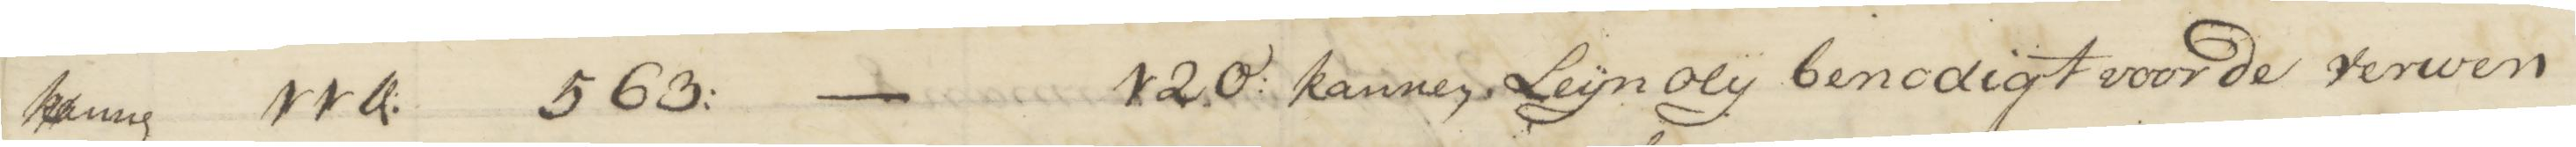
kannen 114: 563: — 120: kannen Leijn olij benodigt voor de verwen
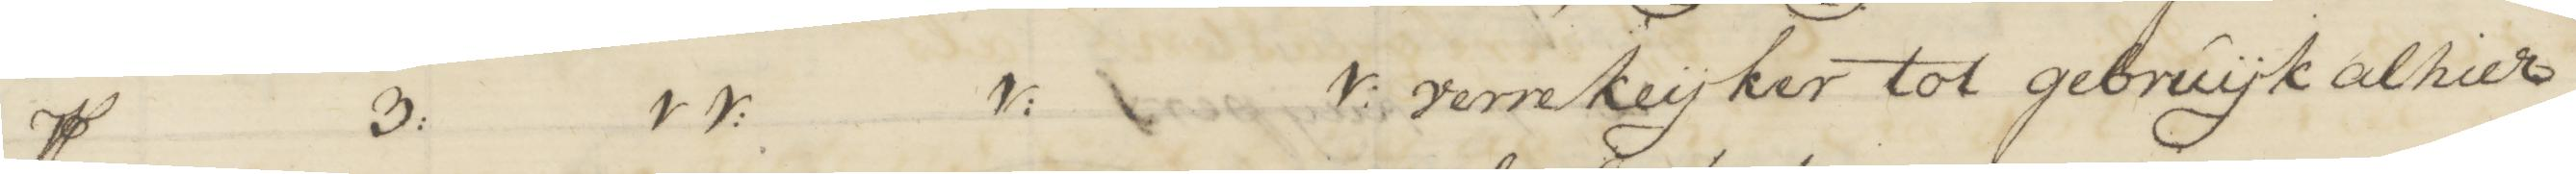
p:s 3: 11: 1: 1: verrekeijker tot gebruijk alhier
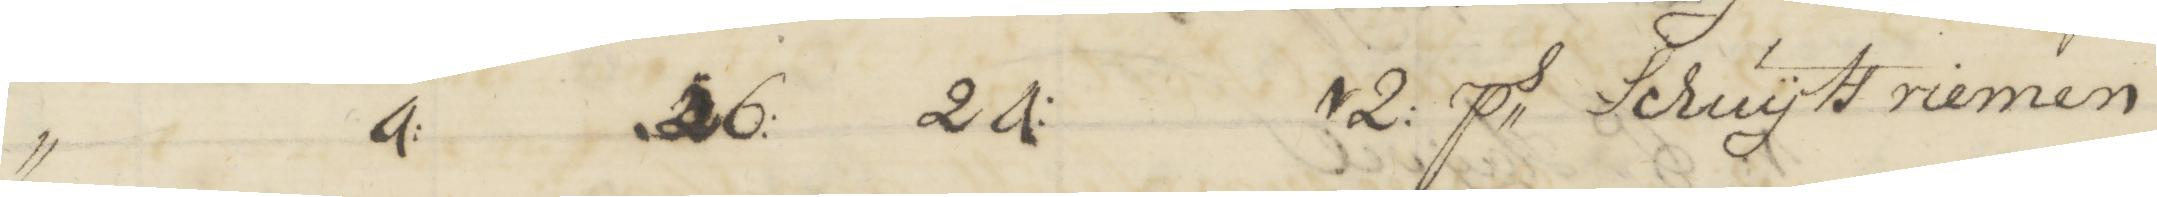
„ 4: 26: 24: 12: p„s schuijts riemen
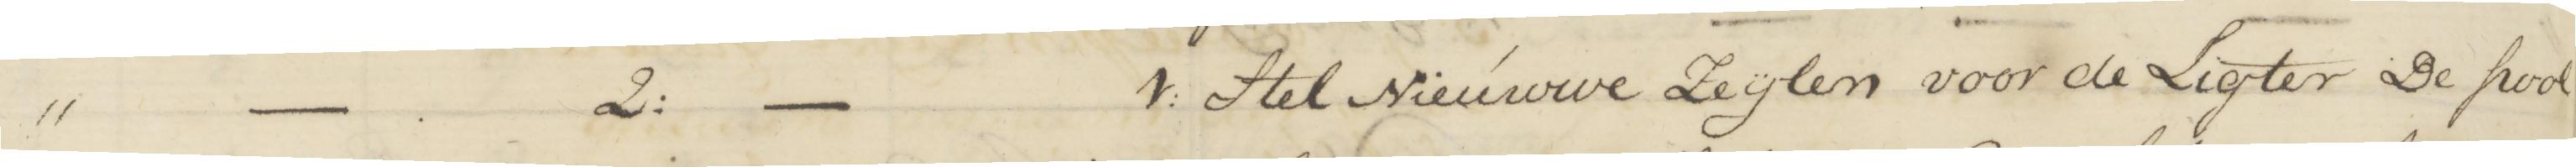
„ — 2: — 1: stel Nieuwwe Zeijlen voor de Ligter De Swol
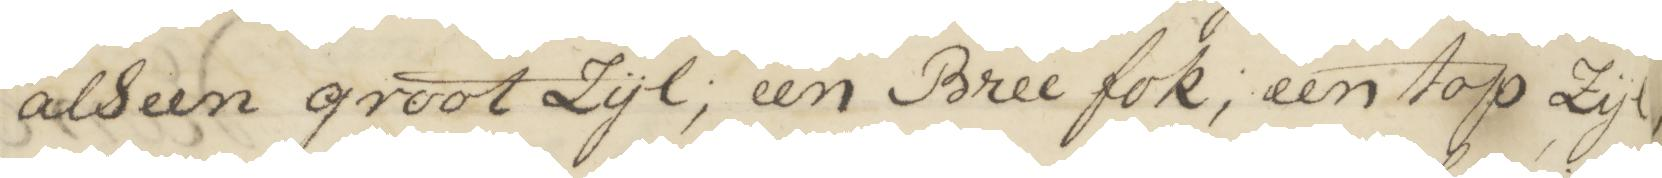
als een groot Zijl; een Bree fok; een top Zijl
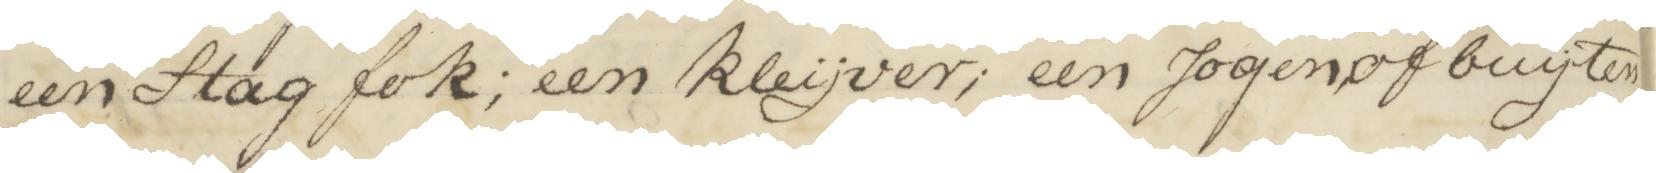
een Stag fok; een kleijver; een Jogen, of buijten
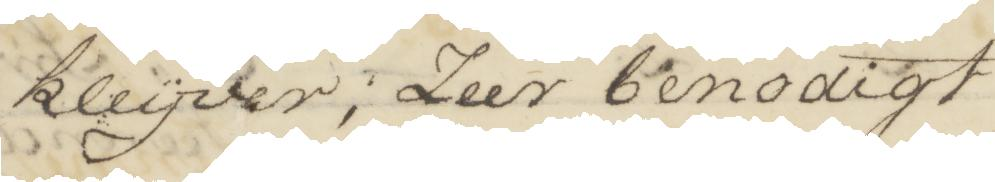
kleijver; Zeer benodigt
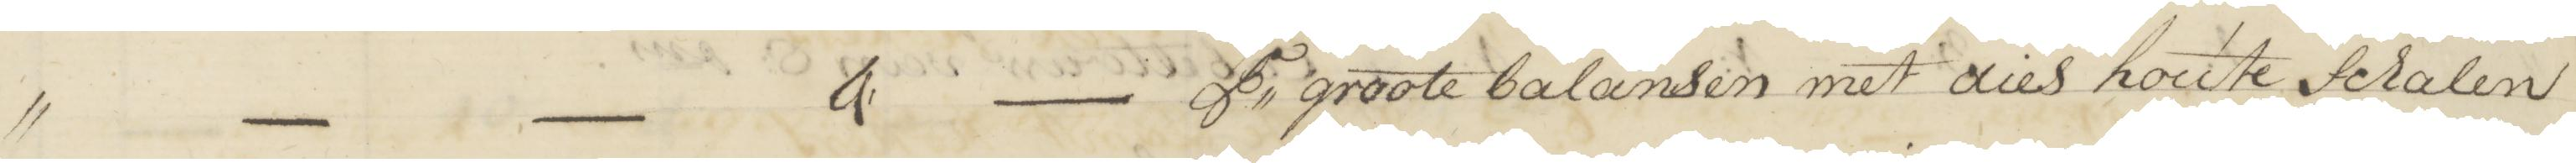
„ — — 4. — p:s groote balansen met dies houte schalen
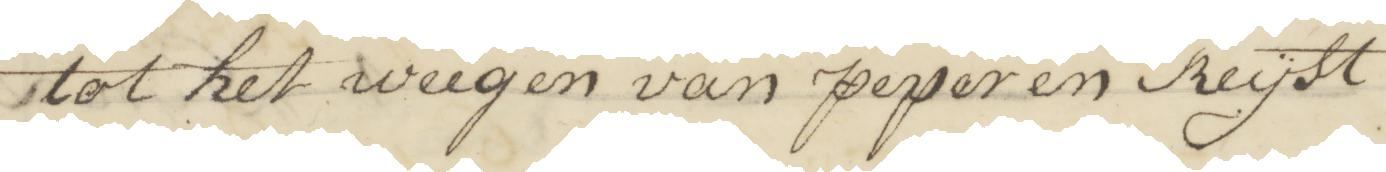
tot het weegen van peper en Reijst
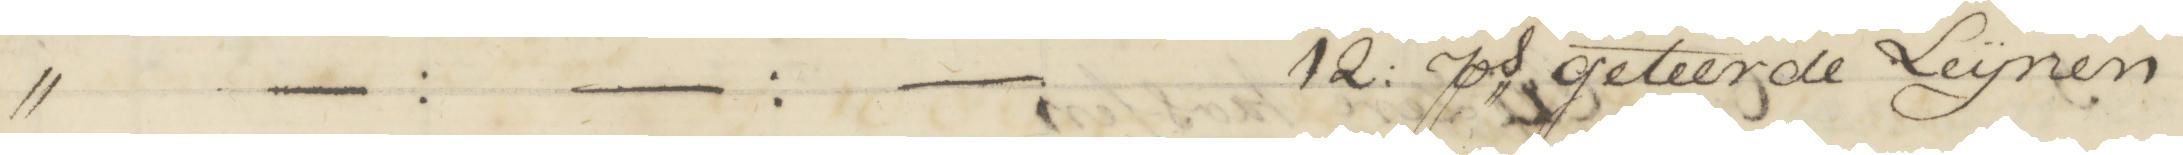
„ — : — : — 12: p„s geteerde Leijnen
